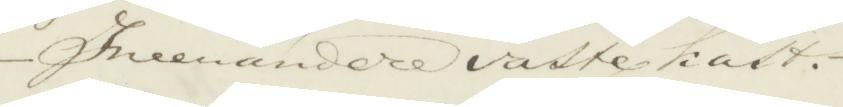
—In een andere vaste-kast.
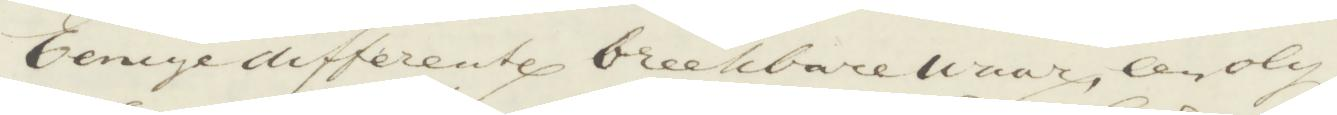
Eenige differente breekbare waar, een oly
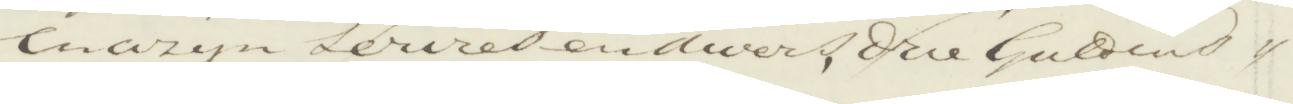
en azyn servies en divers drie Guldens „
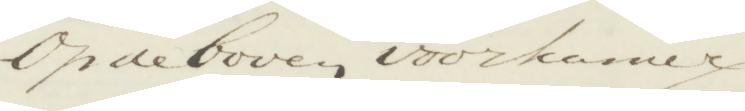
Op de boven voorkamer
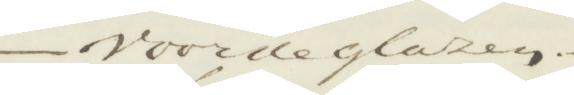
—voor de glazen.
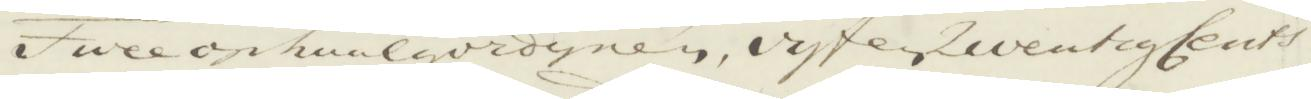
Twee ophaalgordynen, vyf en zeventig Cents
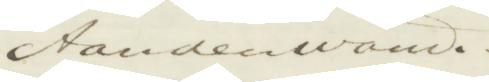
Aan den wand.
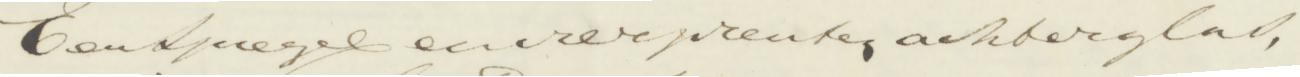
Een spiegel een vier prenten achter glas,
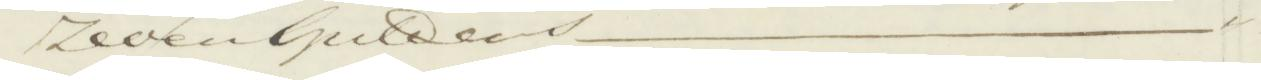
Zeven Guldens—„
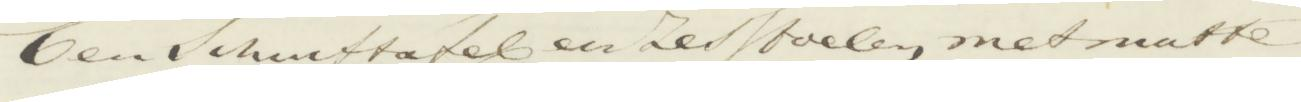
Een schuiftafel en Zes stoelen met matte
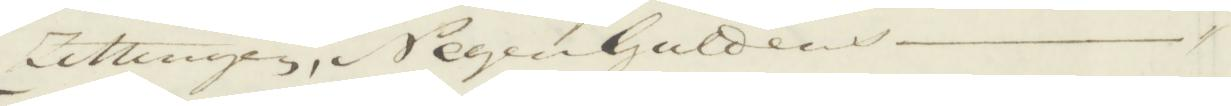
zittingen, Negen Guldens—„
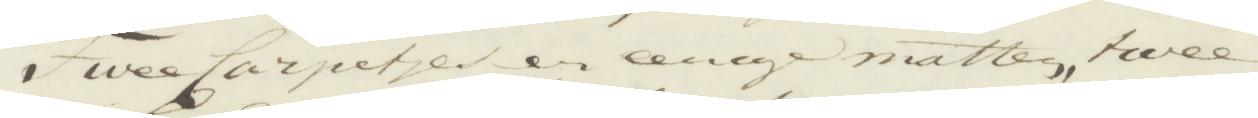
Twee Carpetjes en eenige matten, twee
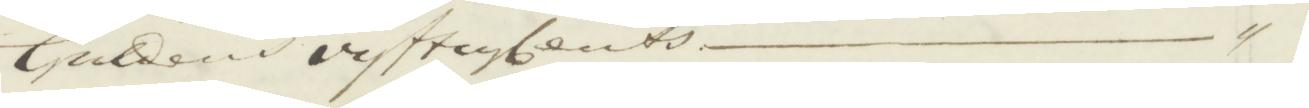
Guldens vyftig Cents.—„
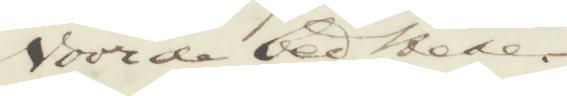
voor de bedstede.
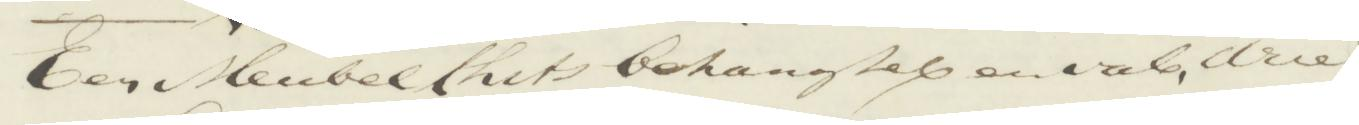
Een Meubel Chits behangzel en val, drie
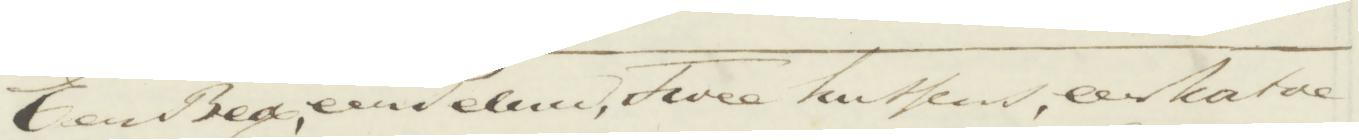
Een Bed, een Peluw, twee kussens, een katoe
